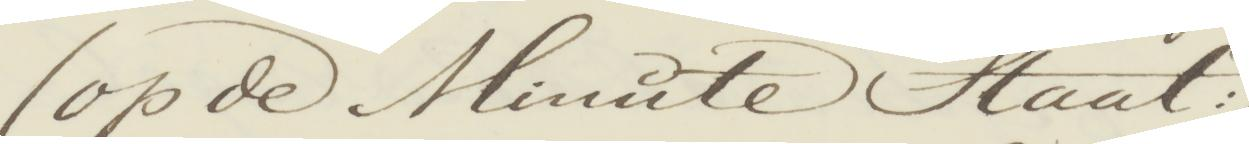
(op de Minute Staat:)
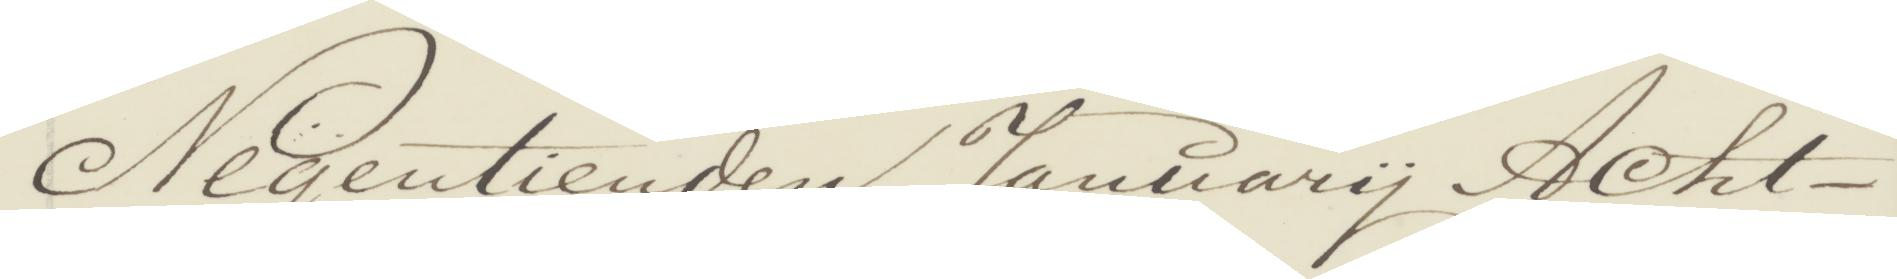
Negentienden Januarij Acht-
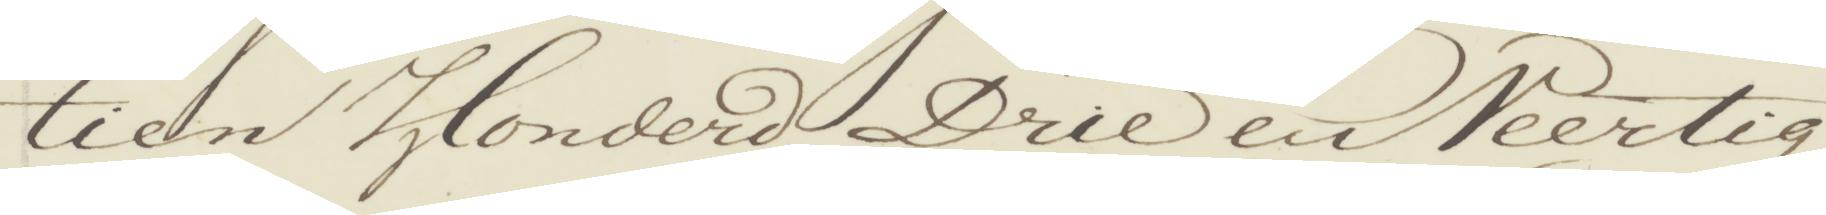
tien Honderd Drie en Veertig
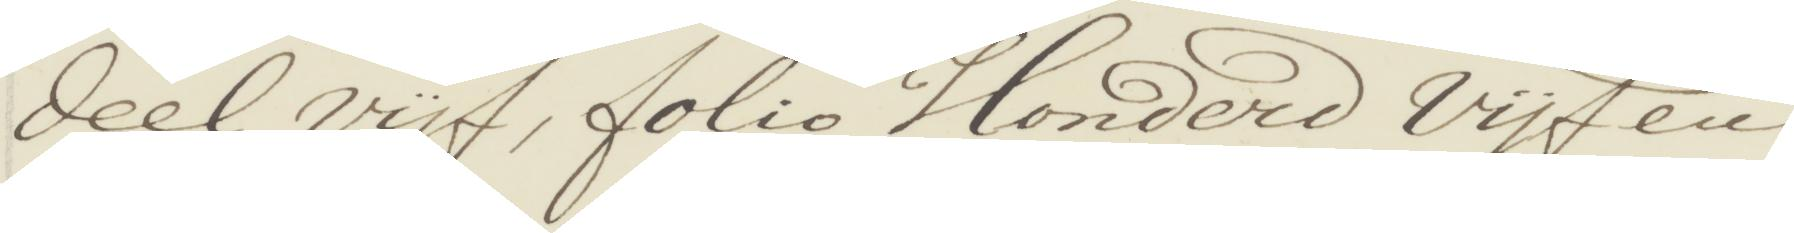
deel vijf, folio Honderd vijf en
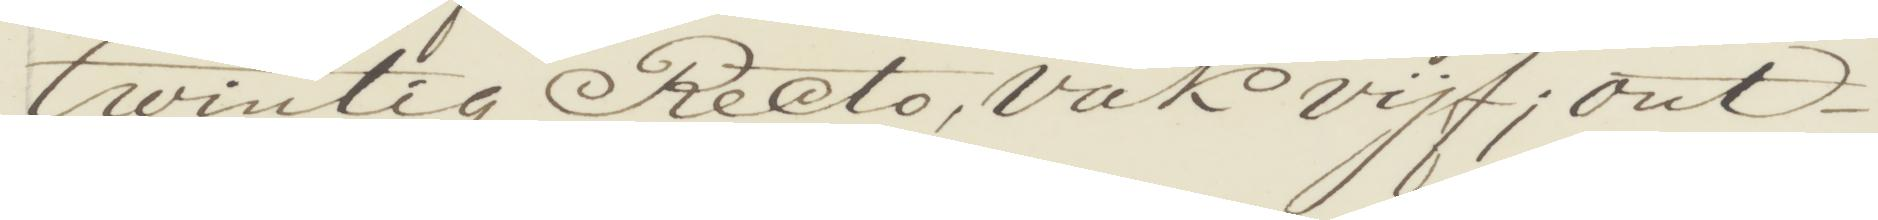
twintig Recto, vak vijf; ont-
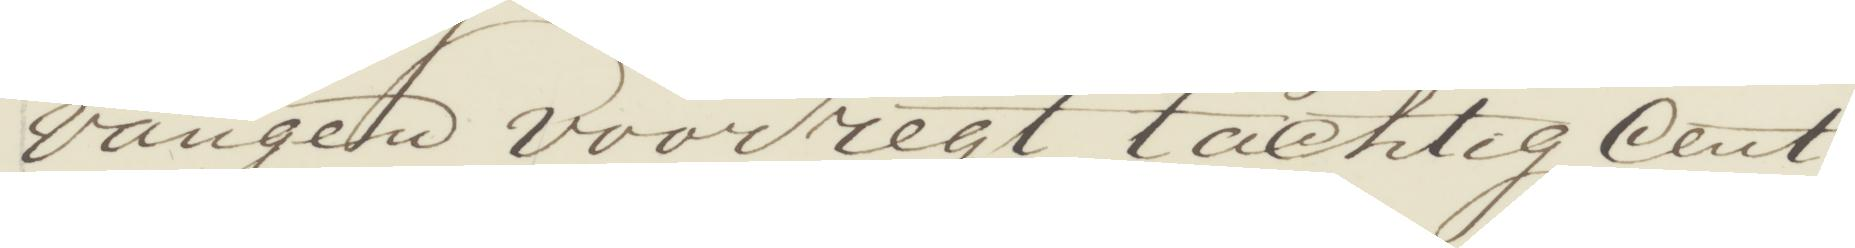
vangen voor regt tachtig Cent
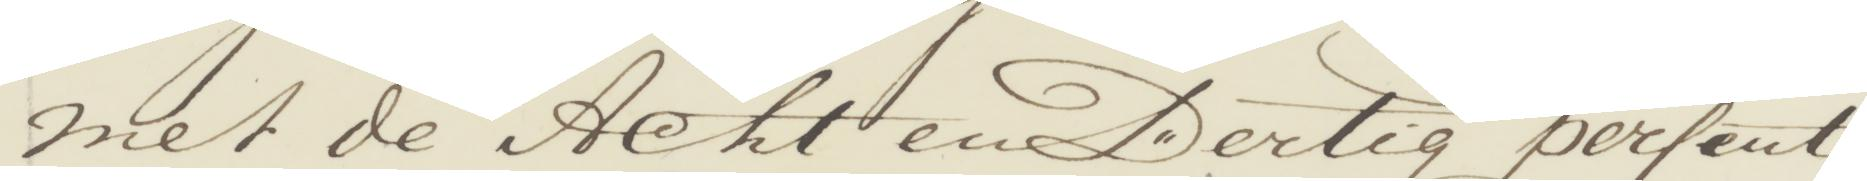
met de Acht en Dertig percent
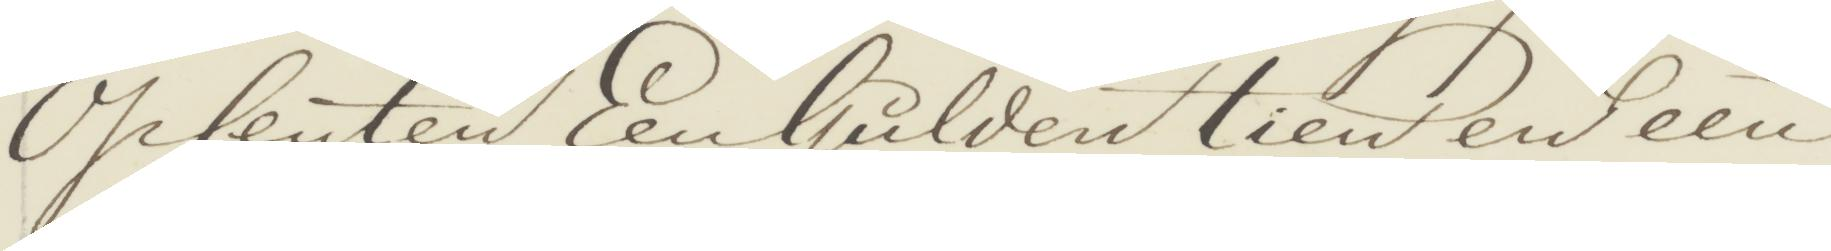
OpCcnten Een Gulden tien en een
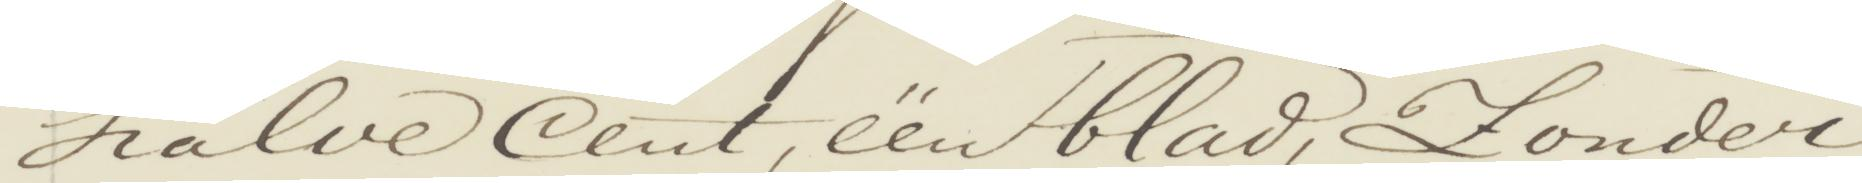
halve Cent, één blad, Zonder
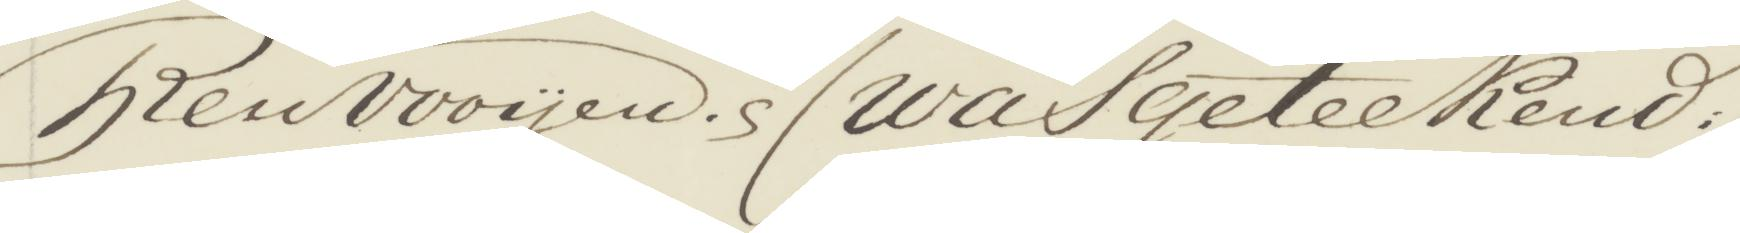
Renvooijen. ~ (was geteekend:)
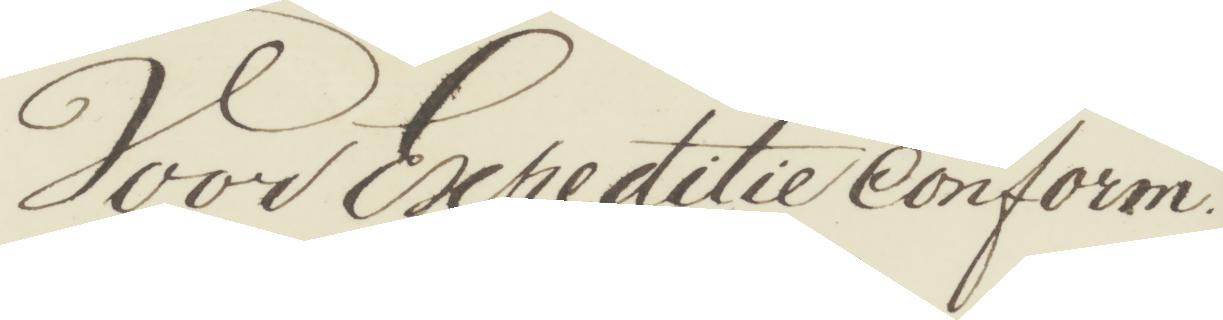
Voor Expeditie conform:
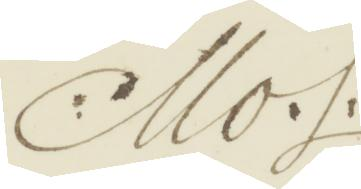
Mo.l.
